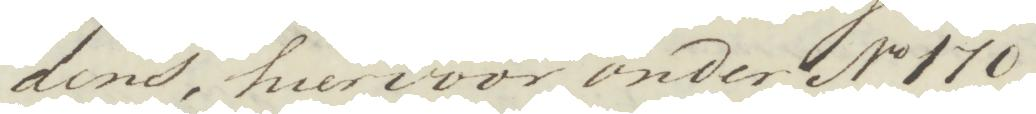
dens, hiervoor onder No 170
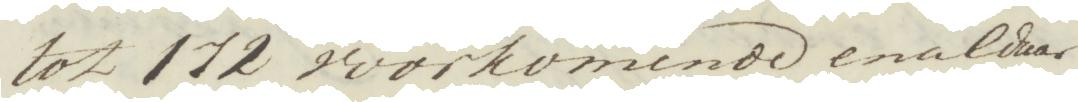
tot 172 voorkomende en aldaar
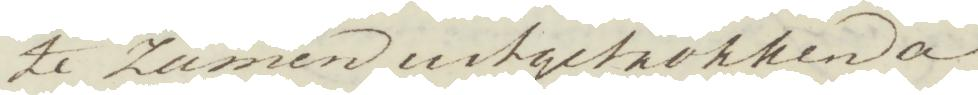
te zamen uitgetrokken a
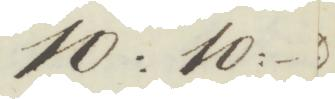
10: 10:-
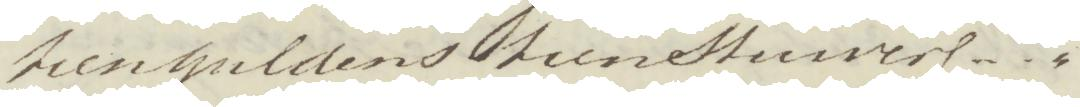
tien Guldens tien stuivers -- - „
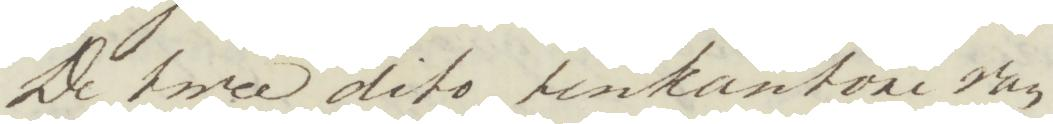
De twee dito, ten kantore van
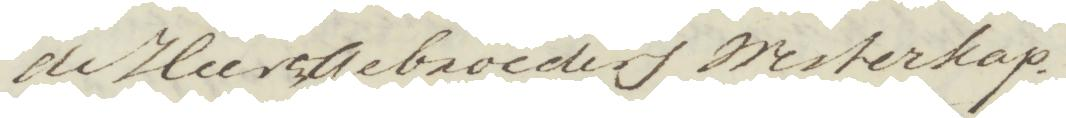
de Heeren Gebroeders Westerkap„
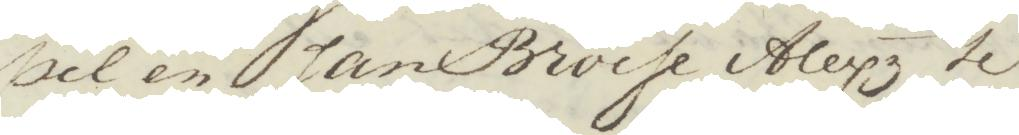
pel en Jan Broese Alexz te
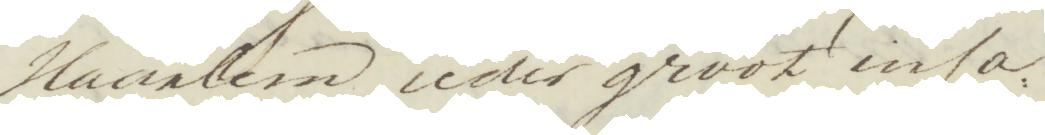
Haarlem, ieder groot in Ca:
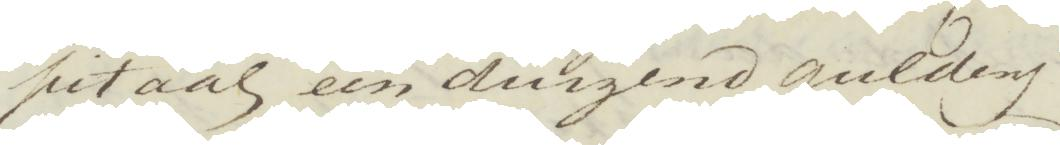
pitaal een duizend guldens
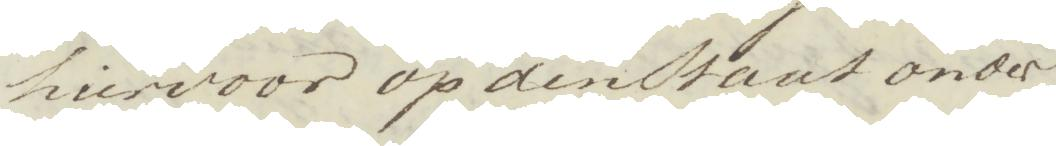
hiervoor op den Staat onder
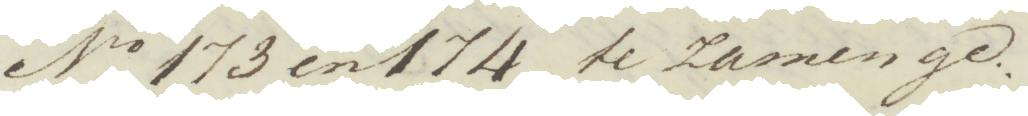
No 173 en 174, te zamen ge„
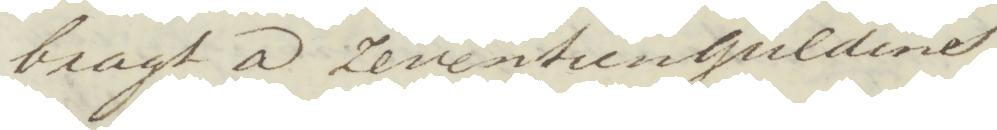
bragt a zeventien guldens
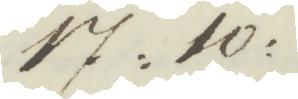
17 : 10:
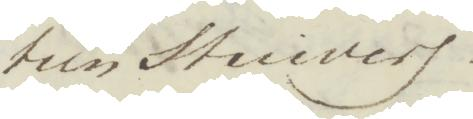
tien stuivers.
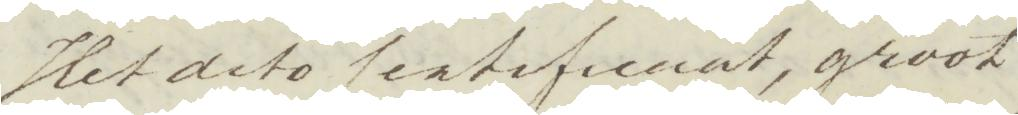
Het dito Centificaat, groot
